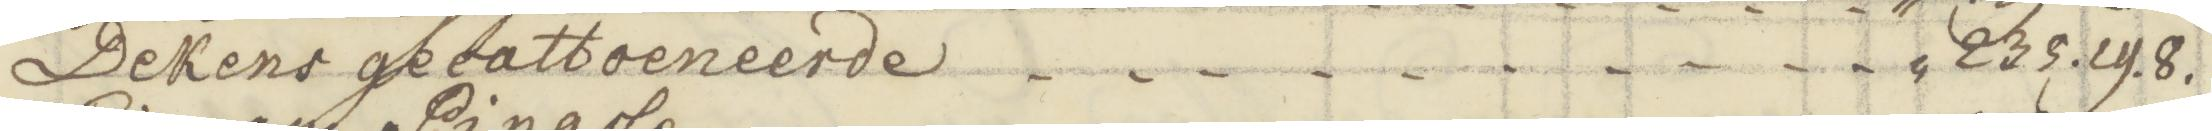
Dekens gecattoeneerde - - - - - - - - - - „ 235. 29. 8.
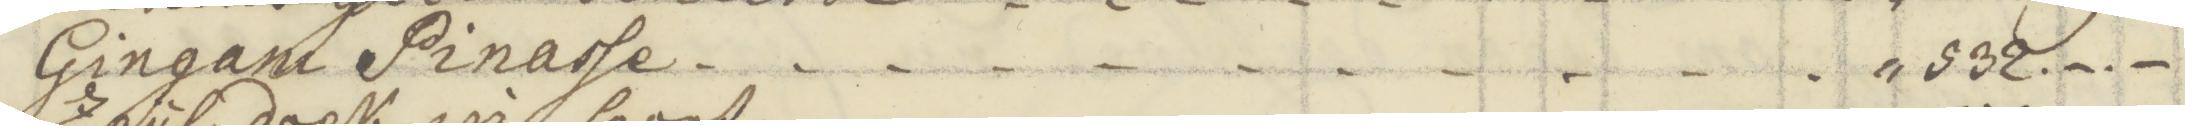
Ginganc Pinasse - - - - - - - - - - - „ 532. —. —
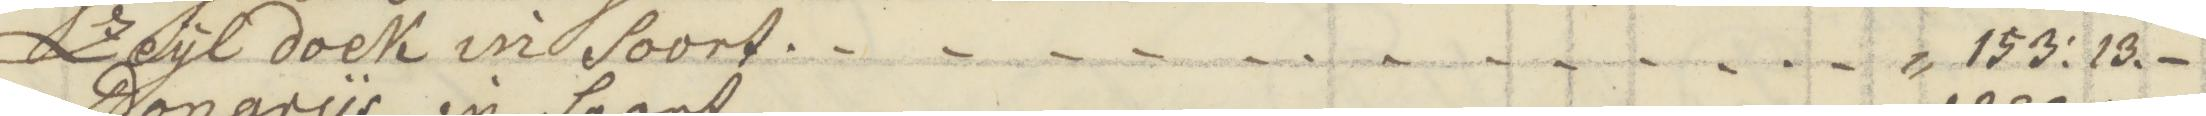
Zeijl doek in soort - - - - - - - - - - - - - - „ 153: 13. —
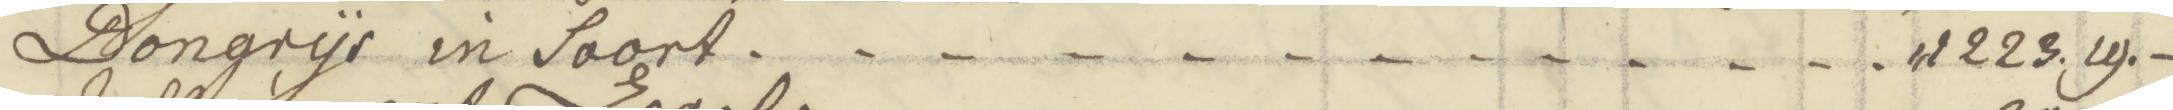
Dongrijs in soort - - - - - - - - - - - - - „ 1223. 19. —
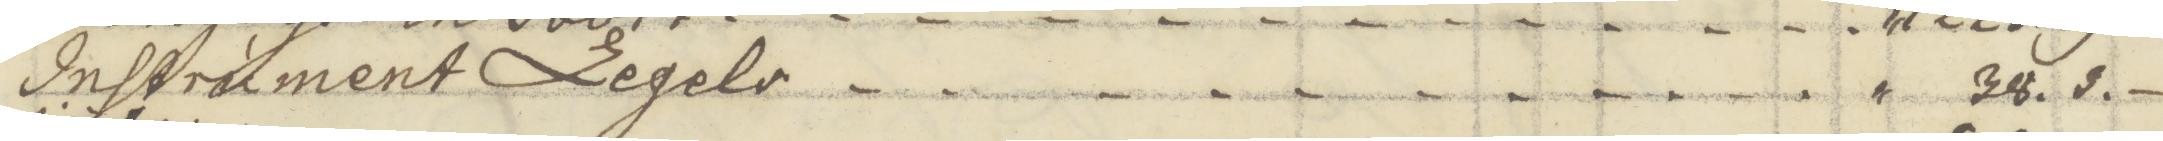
Instrument Zegels - - - - - - - - - - - „ 38. 1. —
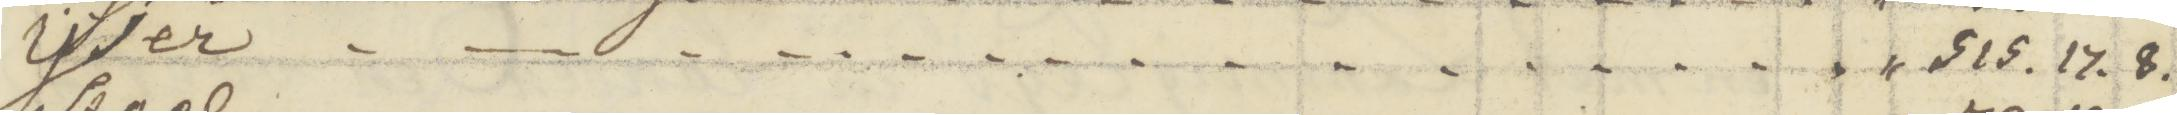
IJser - - - - - - - - - - - - - - - - - „ 515. 17. 8.
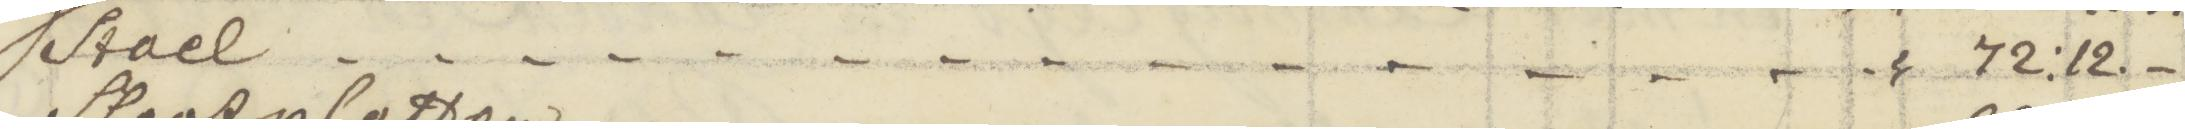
stael - - - - - - - - - - - - - - - „ 72: 12. —
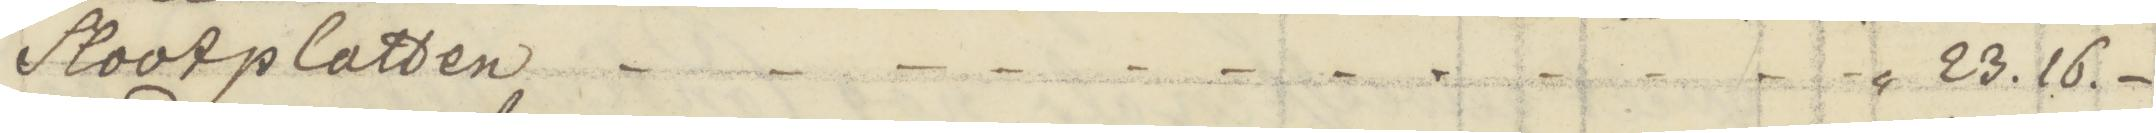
slootplatten - - - - - - - - - - - - „ 23. 16. —
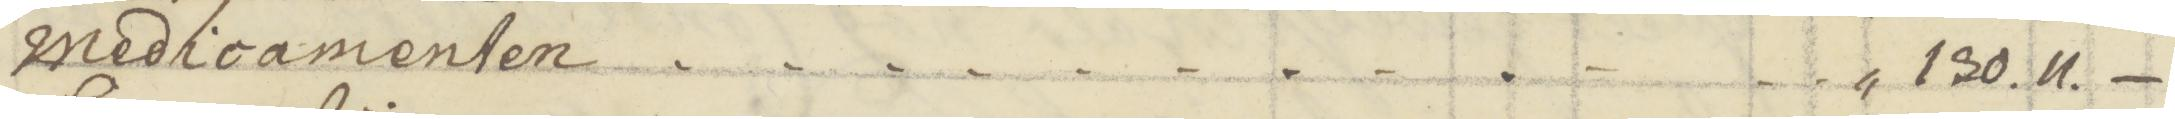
medicamenten - - - - - - - - - - - - „ 130. 11. —
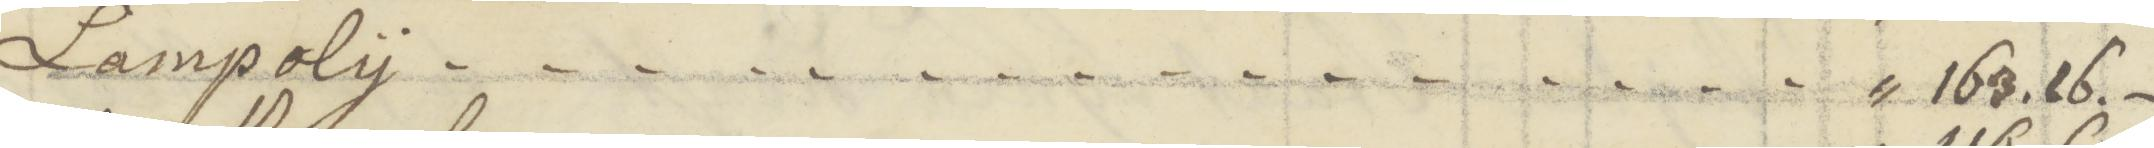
Lampolij - - - - - - - - - - - - - - - - „ 163. 16. —
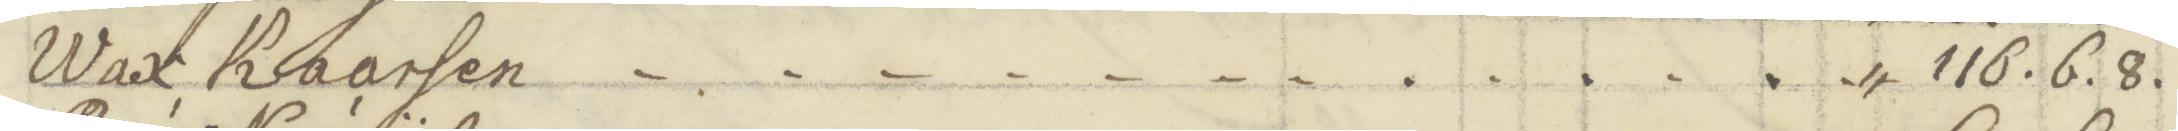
Wax Kaarsen - - - - - - - - - - - - - „ 116. 6. 8.
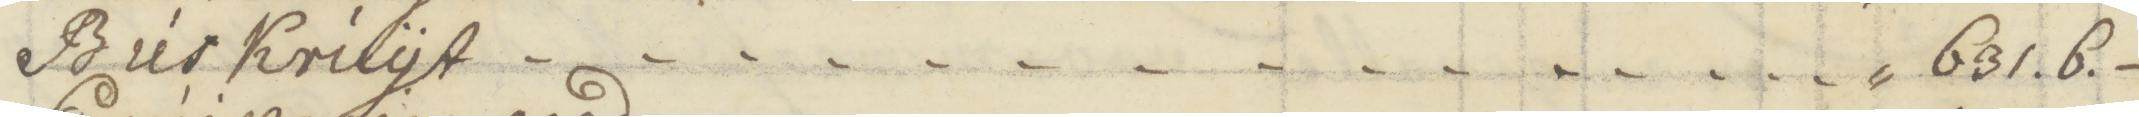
Bus Kruijt - - - - - - - - - - - - - - - „ 631. 6. —
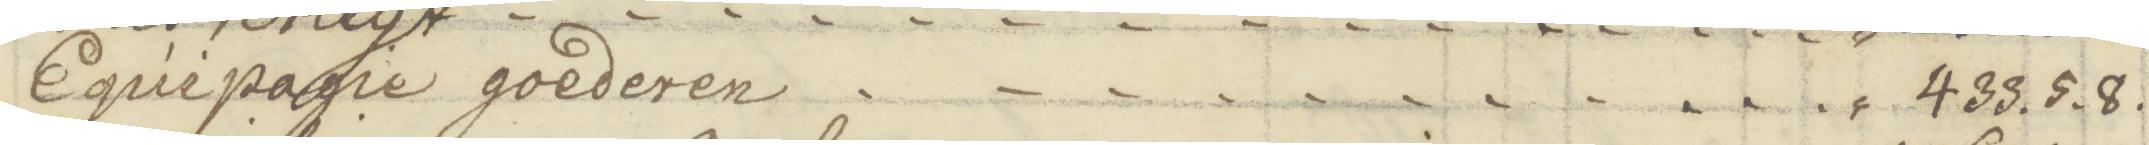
Equipagie goederen - - - - - - - - - - - „ 435. 5. 8
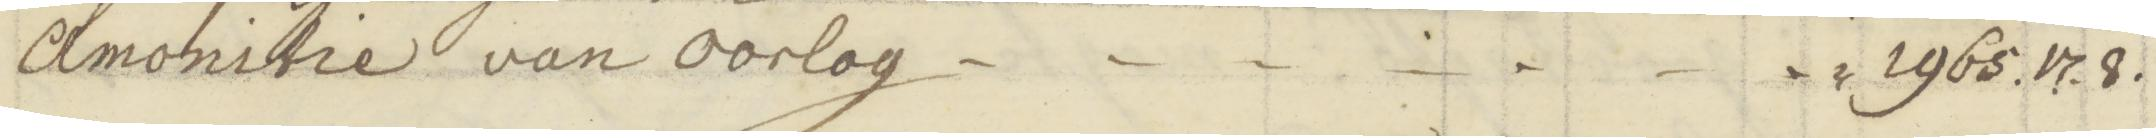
Amonitie van Oorlog - - - - - - - „ 1965. 17. 8.
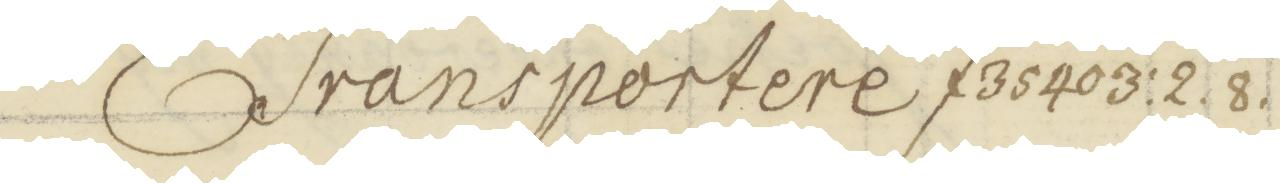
Transportere ƒ 35403: 2. 8.
